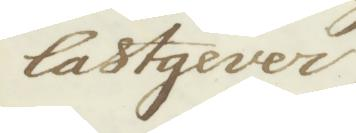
lastgever
